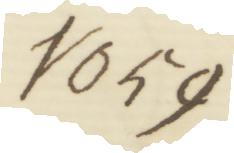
1059
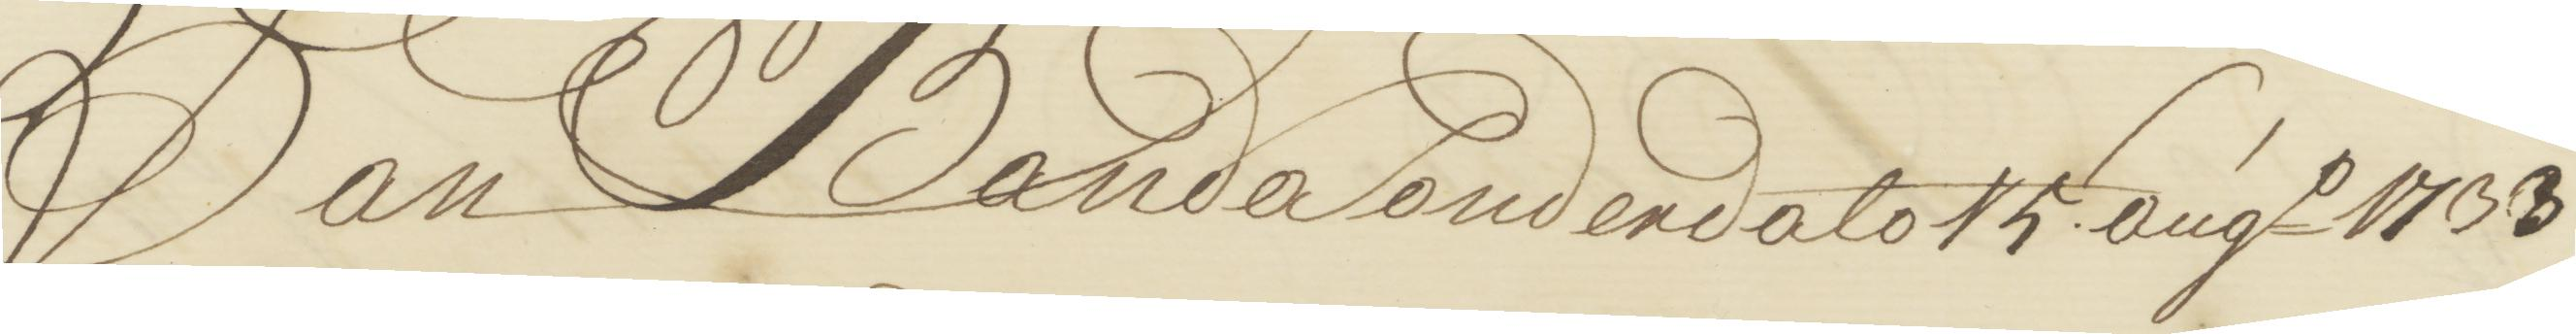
Van Banda onderdato 15.' aug=o 1733
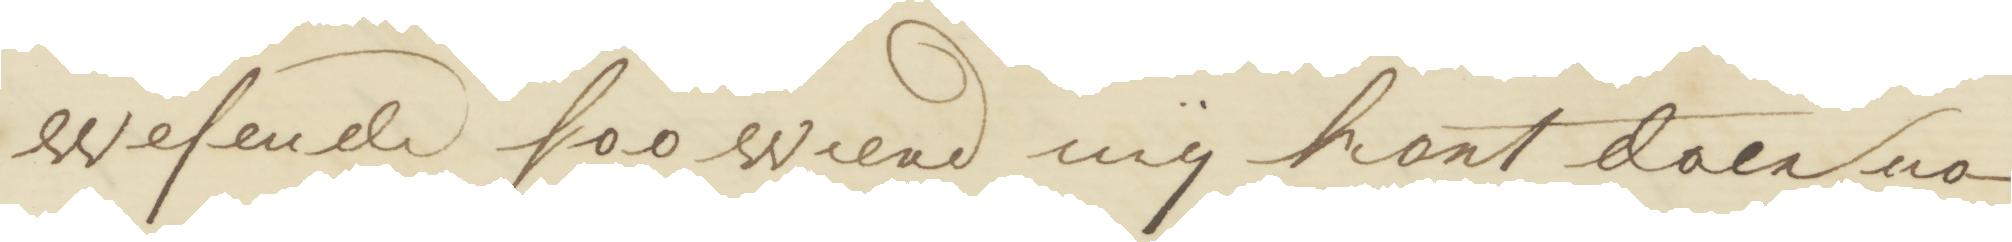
wesende soo wierd mij kort daer na
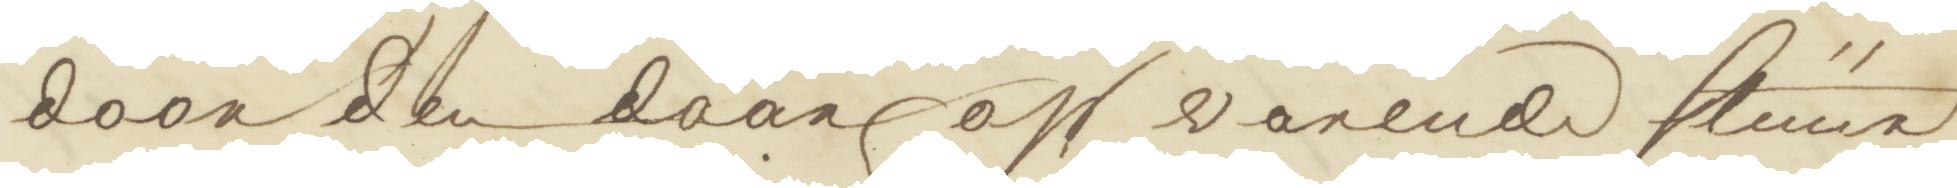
door den daar op varende stuur
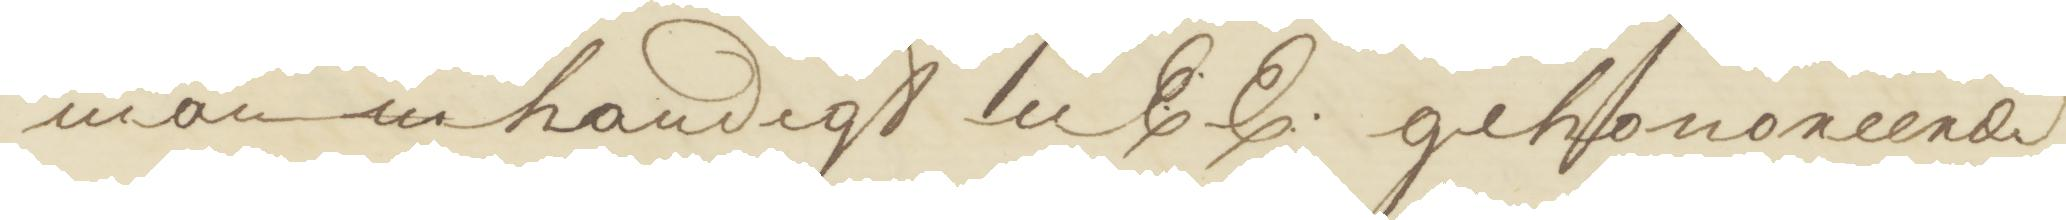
man inhandigt u E E: gehonoreerde
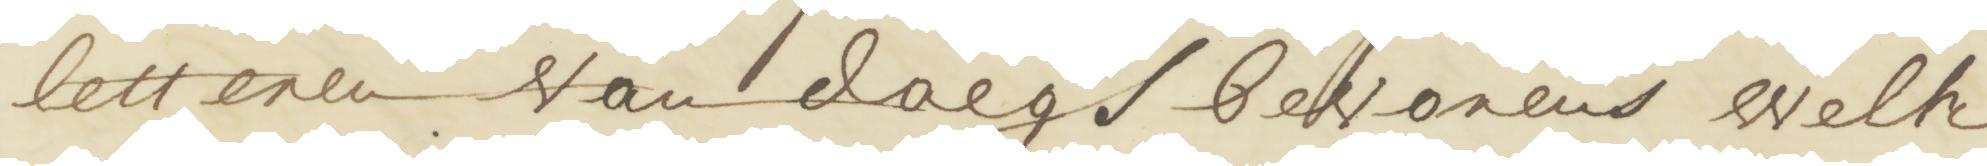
letteren van daegs bevorens welk
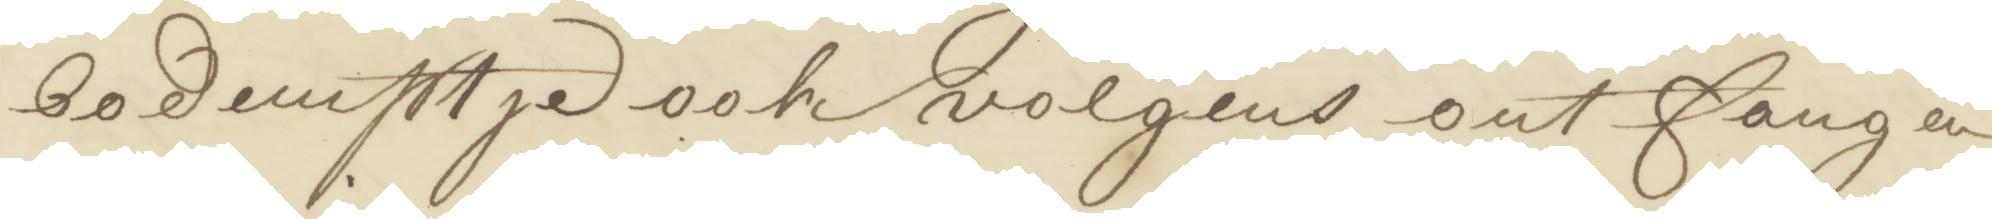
bodemptje ook volgens ontfangen
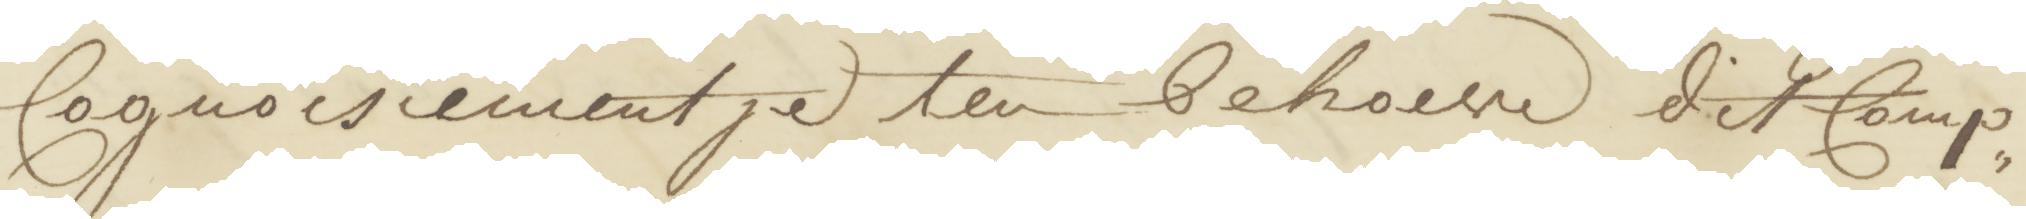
Cognoisiementje ten behoeve dit Comp„
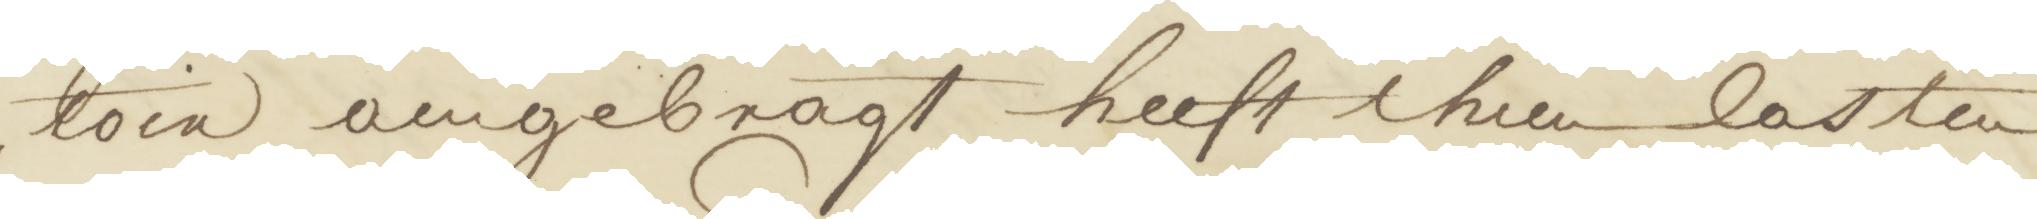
„toir, aengebragt heeft thien lasten
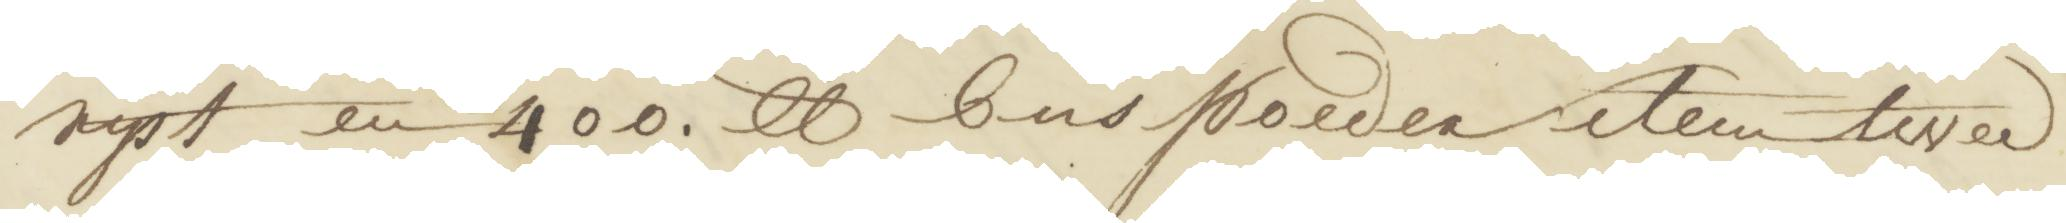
rijst, en 400. lb buspoeder, item twee
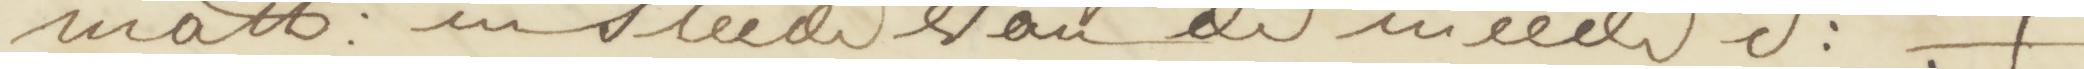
matt:s in steede van de meede d:o
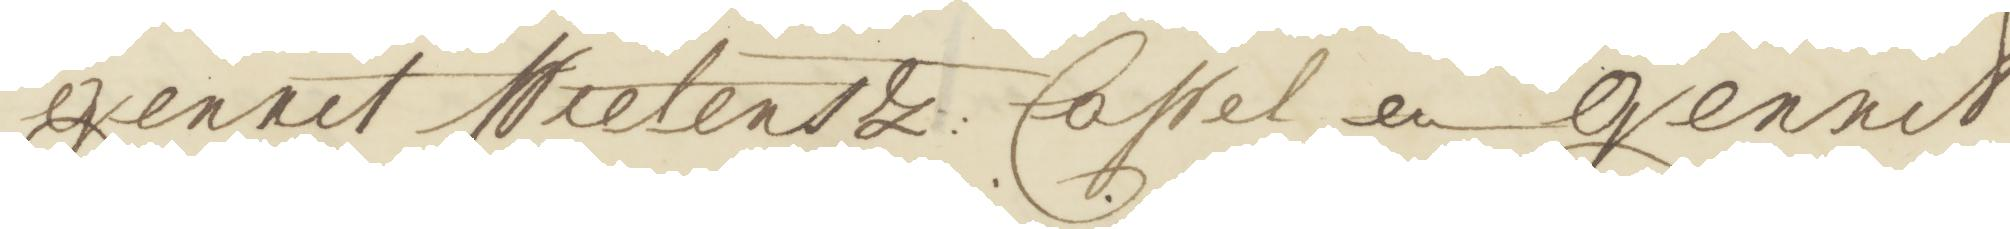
gerrit pietersz: Cassel, en gerrit
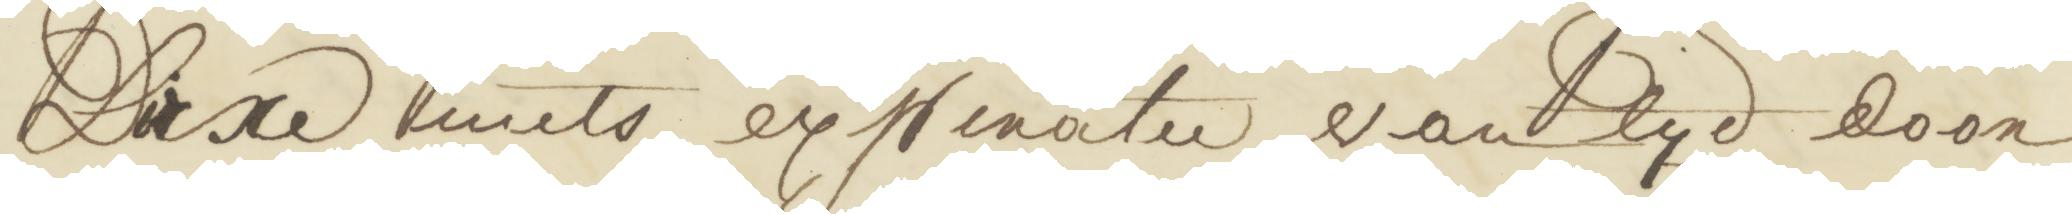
Dirxe, mits expiratie van tijd door
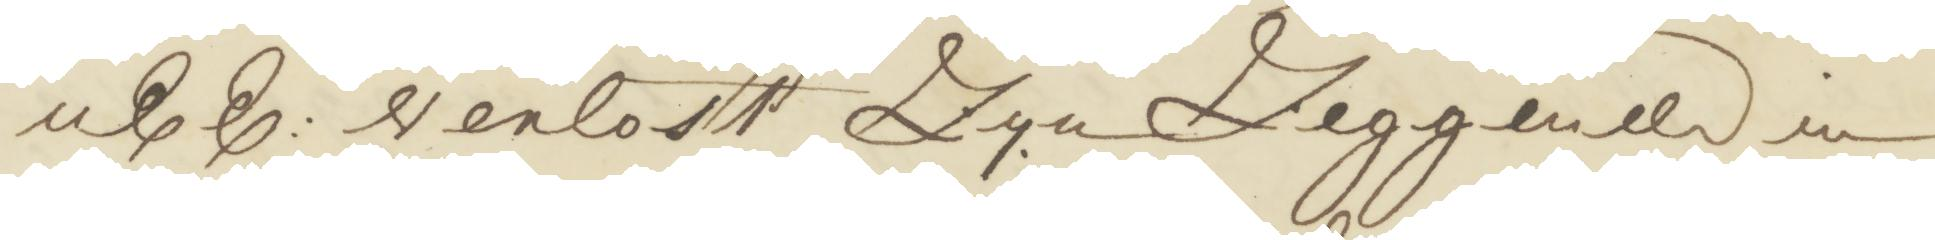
uE E: verlost Zijn Zeggende in
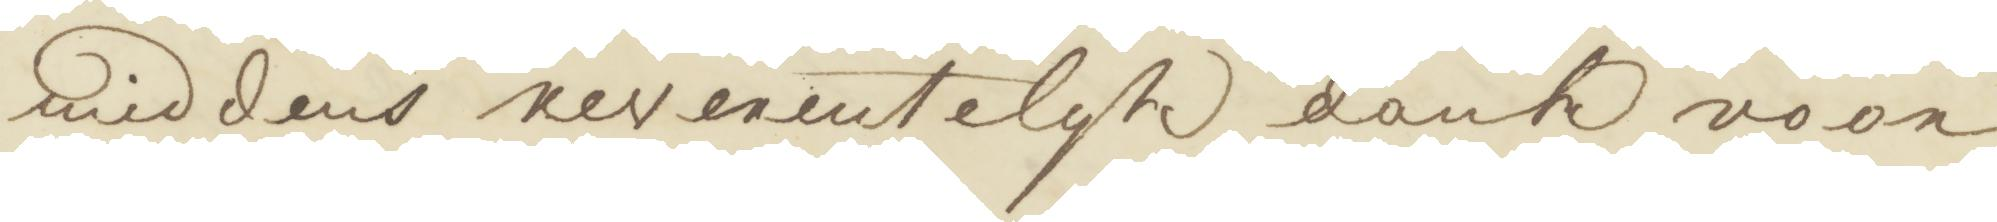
middens reverentelyk dank voor
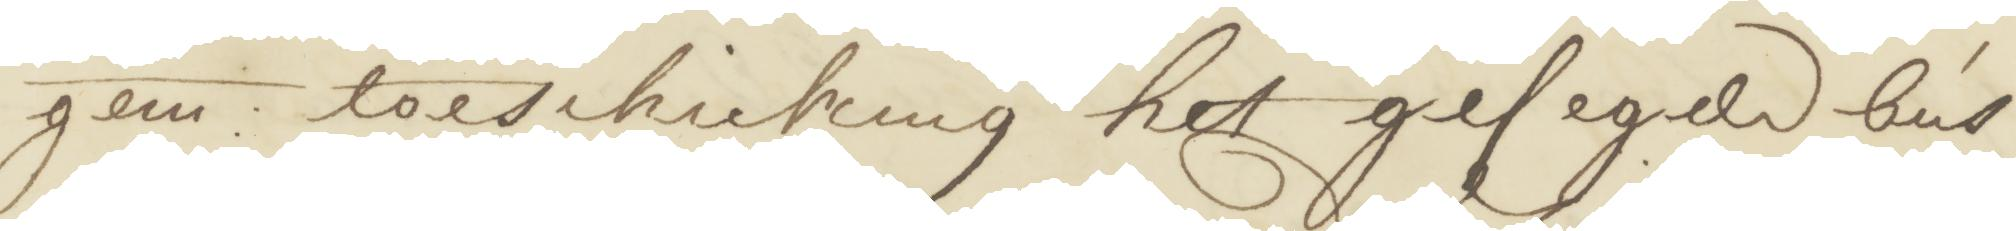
gem: toeschicking het gesegde bus
